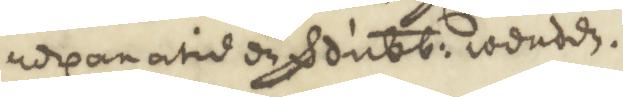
reparatie en verdubb: werden.
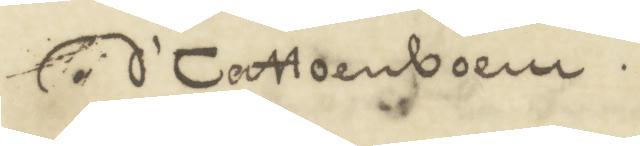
d’ Cattoenboem .
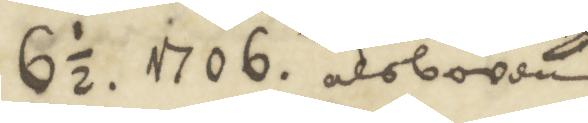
6½. 1706. als boven
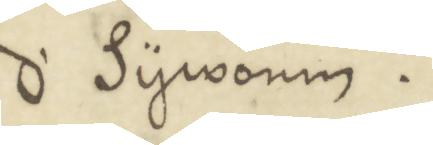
d’ Sijwonin.
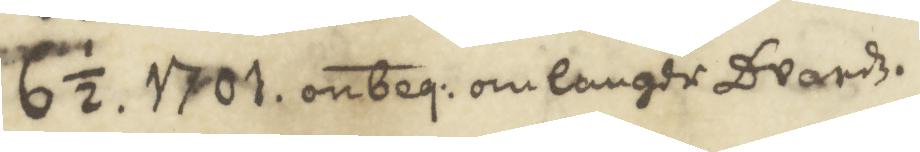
6½. 1701. onbeq: om langer te varen.
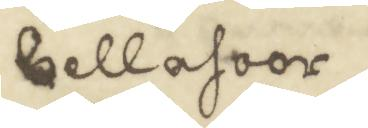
bellasoor
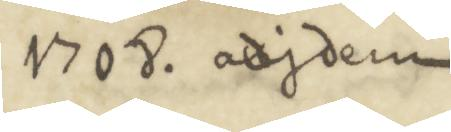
1708. adjdem
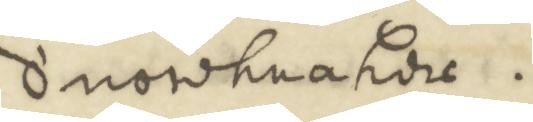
d’ notekraker
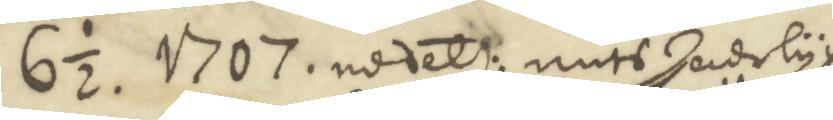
6½. 1707. redelijk mits Jaerlijx
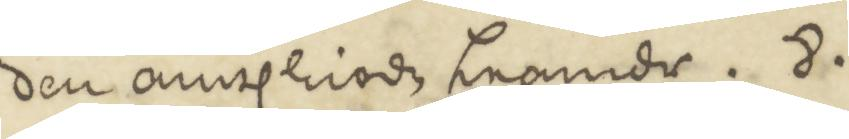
den amphioen kramer . 8.
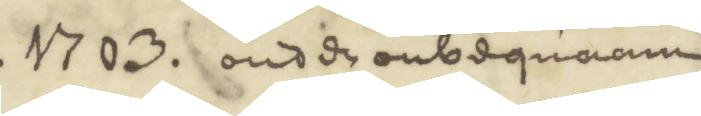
1703. ouder onbequaam
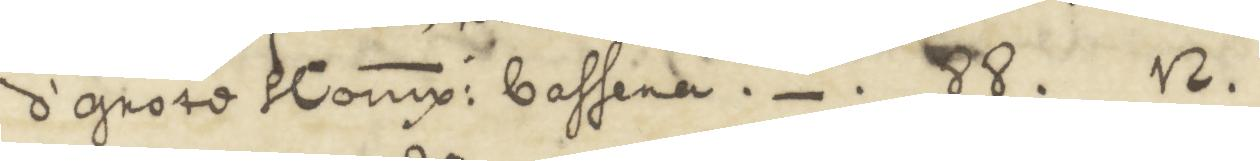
d’ grote sComp:' bassera . – . 88. 12.
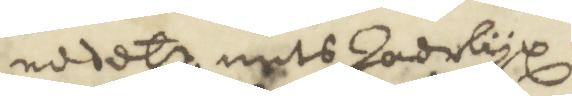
redelijk mits Jaerlijx
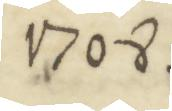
1708
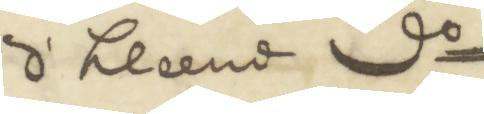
d’ kleene _=o
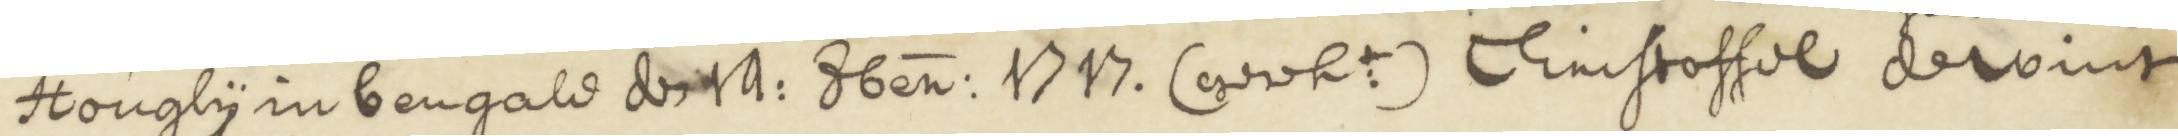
Houglij in bengale den 14: 8ber: 1717. (getek:t) Christoffel de wint
